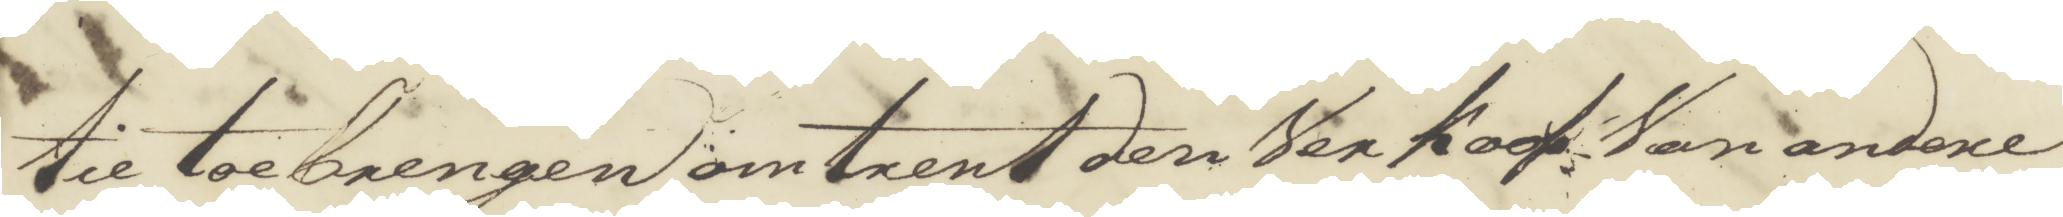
tie toebrengen omtrent den verkoop van andere
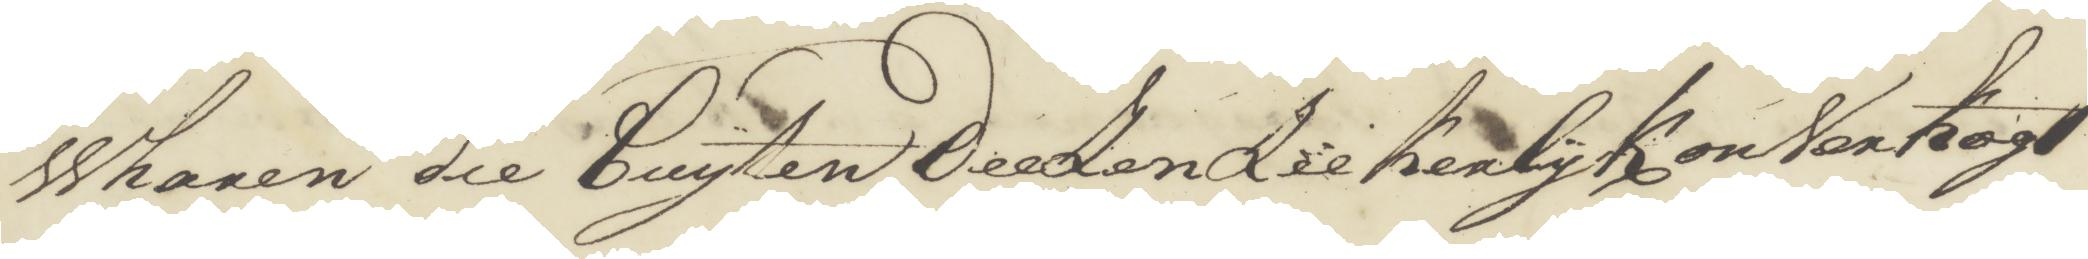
wharen, die buijten deezen zeekerlijk onverkogt
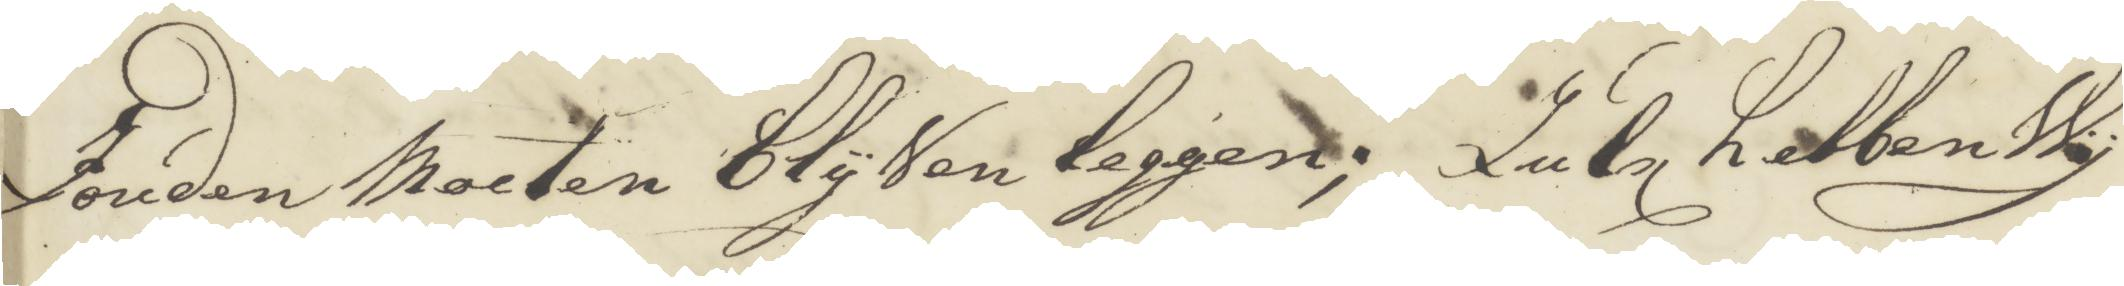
zouden moeten blijven leggen; zulx hebben wij
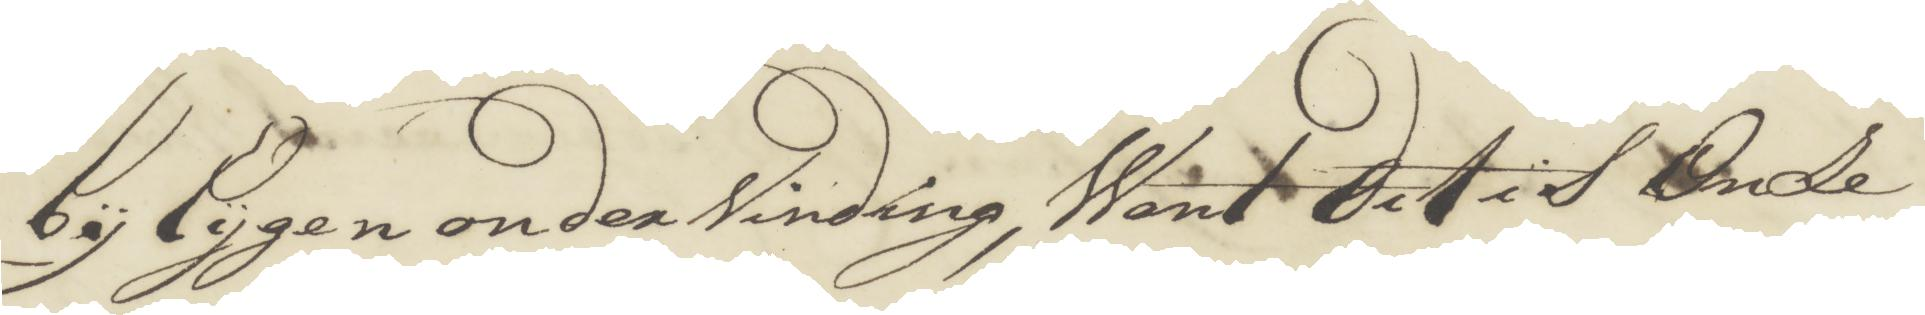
bij Eijgen ondervinding, want dit is Onze
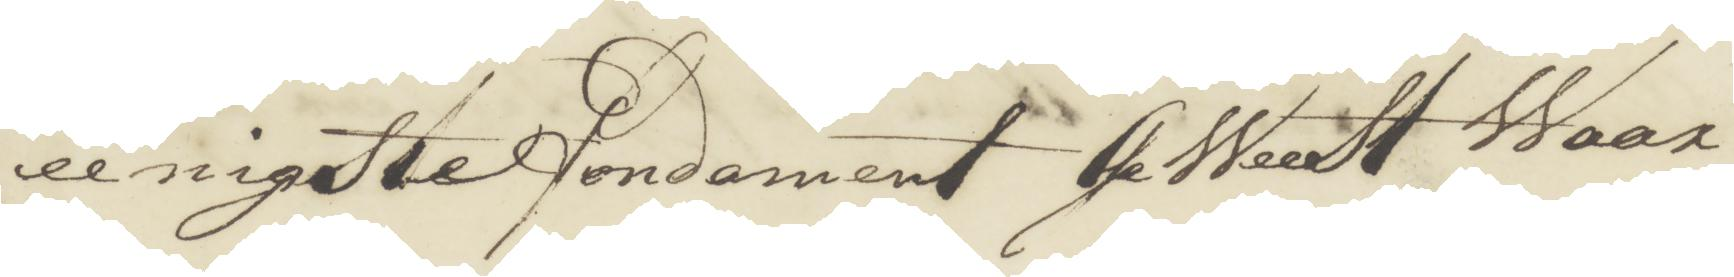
eenigste fondament geweest waar
